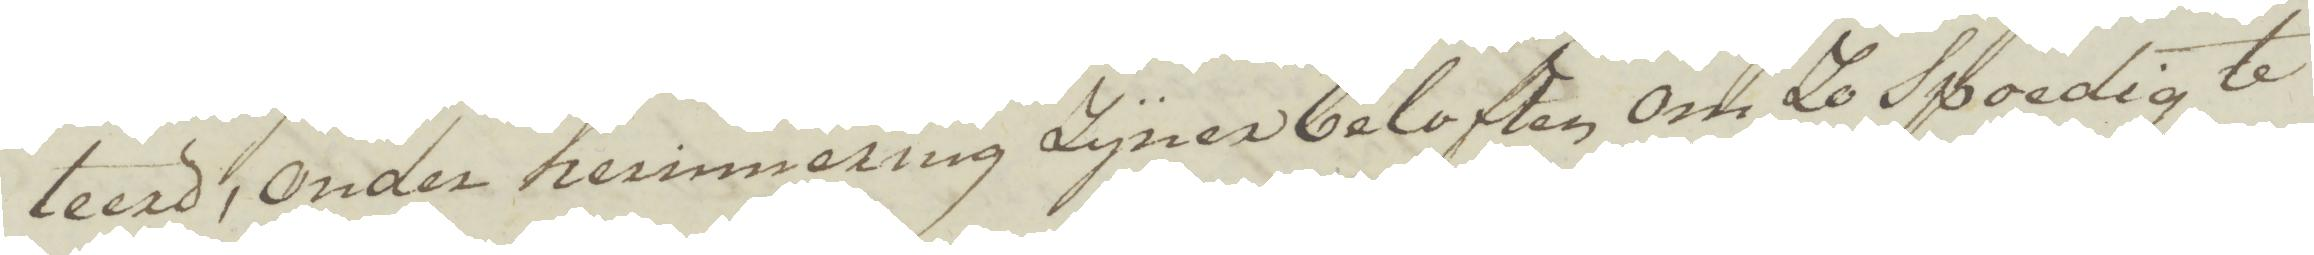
teerd, onder herinnering zijner beloften om zo spoedig te
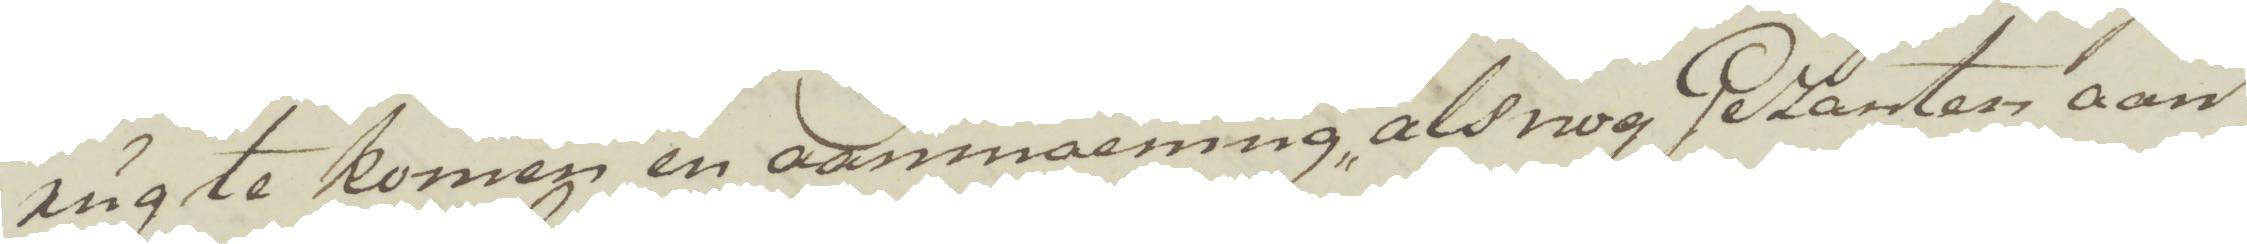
rug te komen en aanmaening„ als nog Gezanten aan
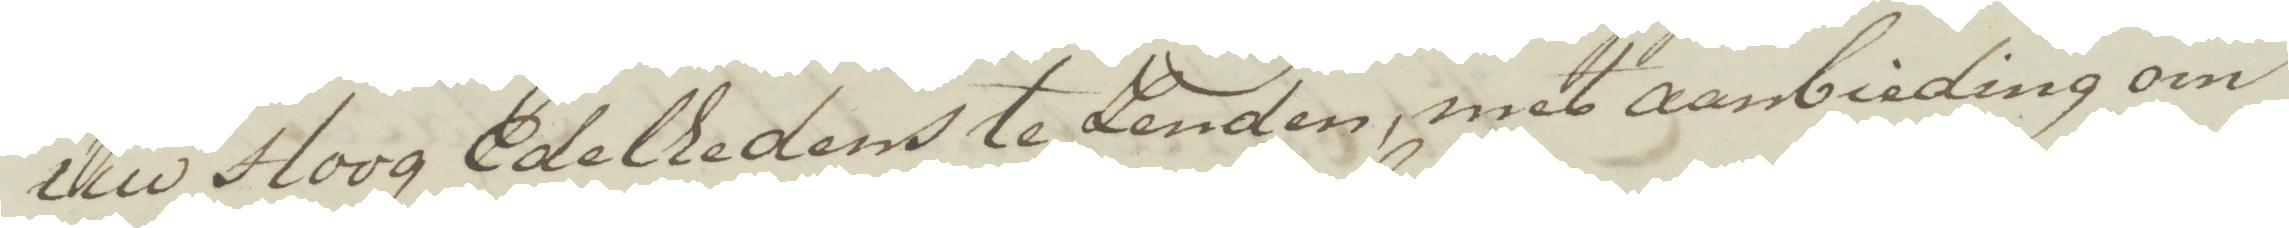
uw Hoog Edelhedens te zenden, met aanbieding om
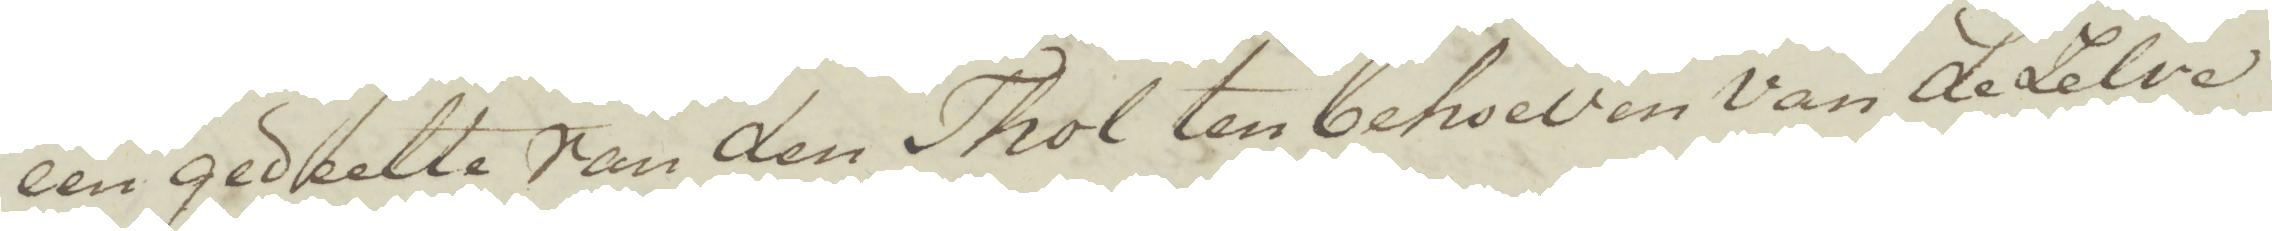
een gedeelte van den Thol ten behoeven van dezelve
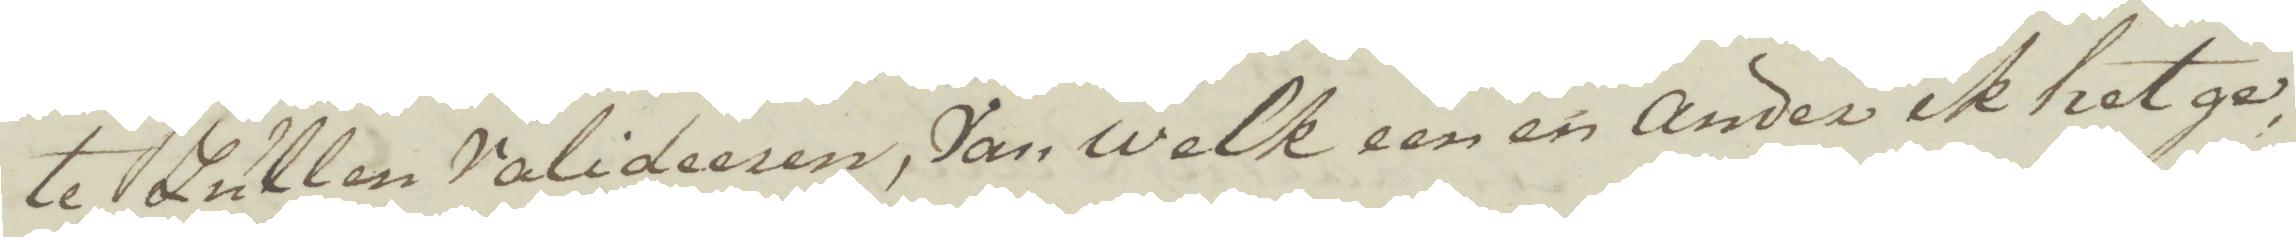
te zullen valideeren, van welk een en ander ik het ge
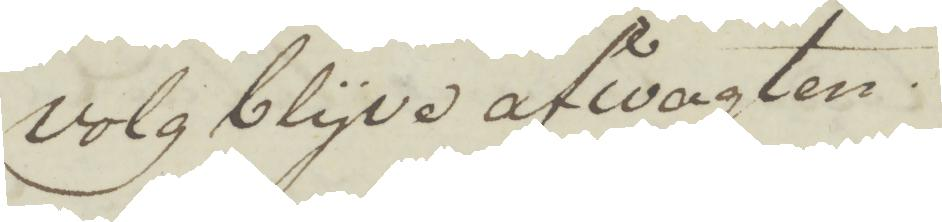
volg blijve afwagten.
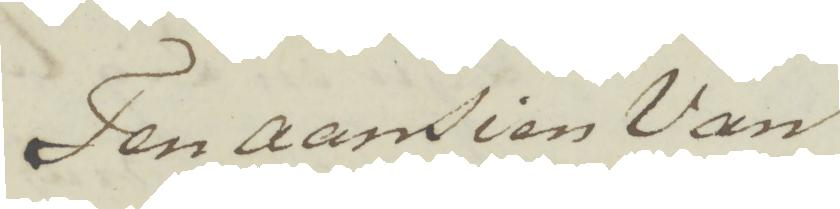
Ten aansien van
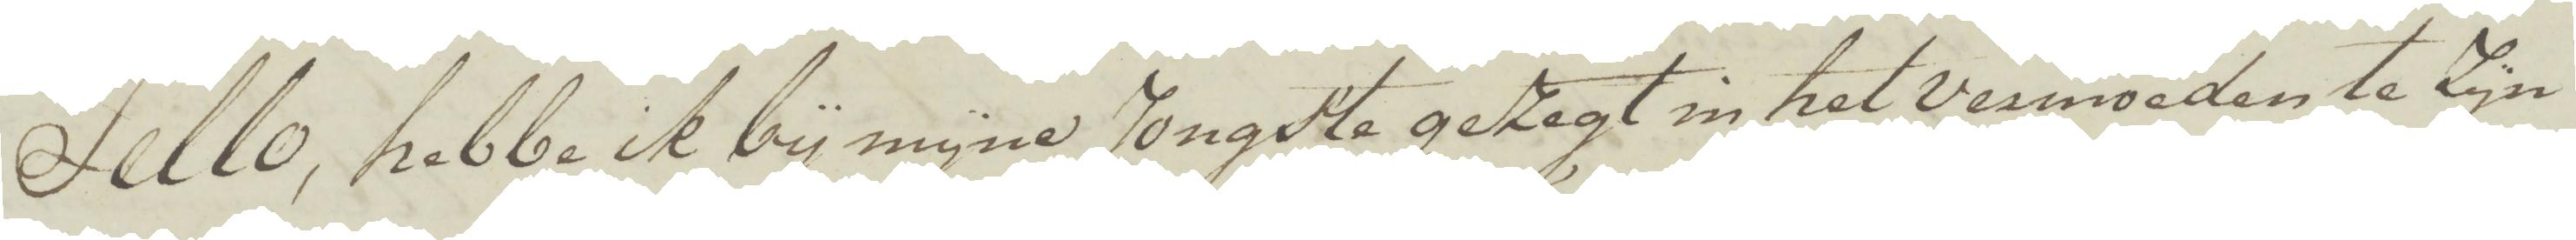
Tello, hebbe ik bij mijne Jongste gezegt in het vermoeden te zijn
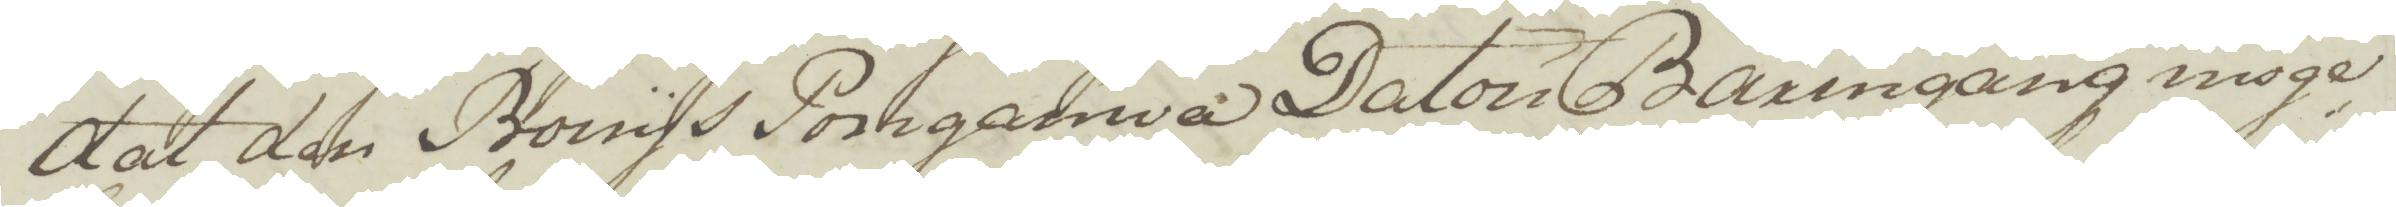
dat den Bonijs Pongauwa Datou Baringang moge„
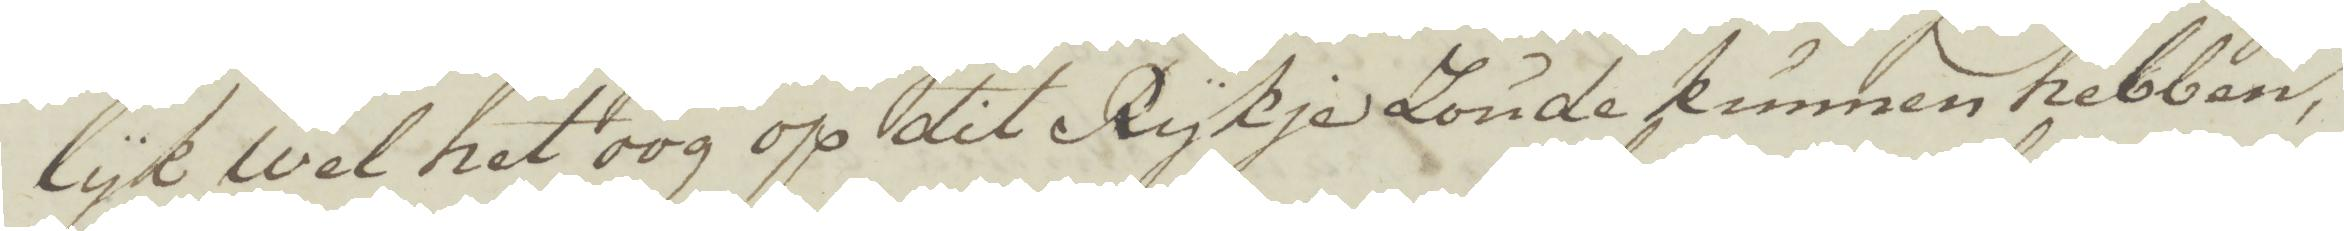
lijk wel het oog op dit Rijkje zoude kunnen hebben,
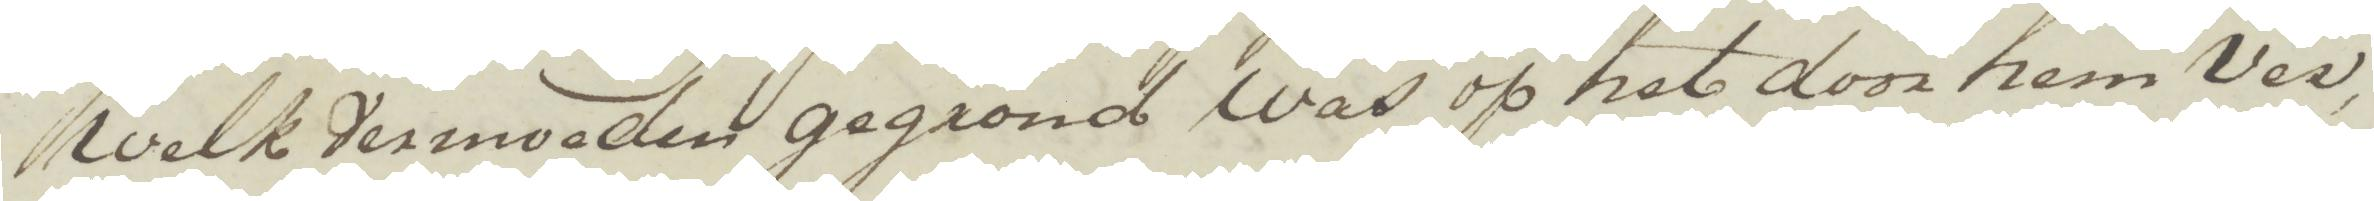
welk vermoeden gegrond was op het door hem ver,
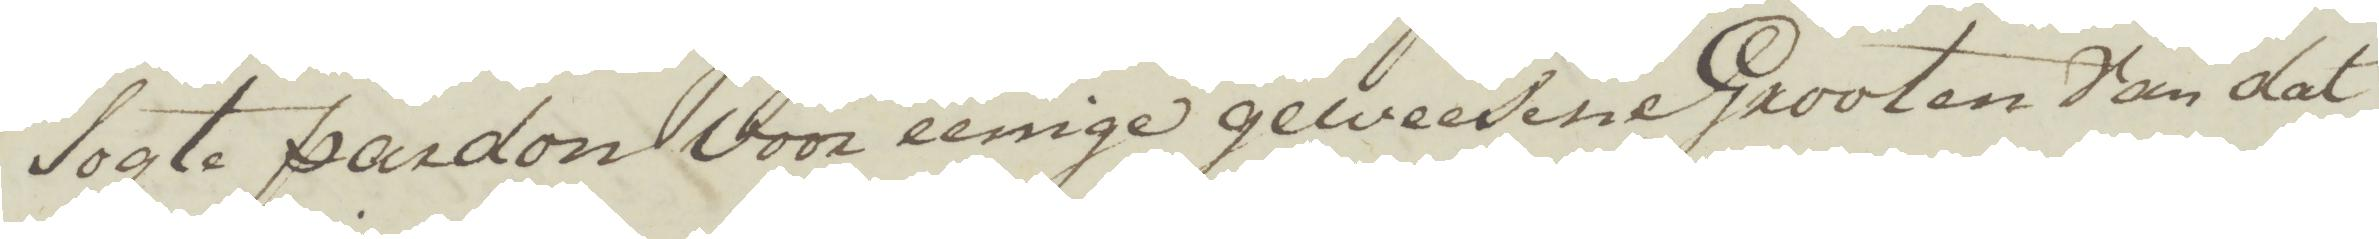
sogte pardon voor eenige geweesene Grooten van dat
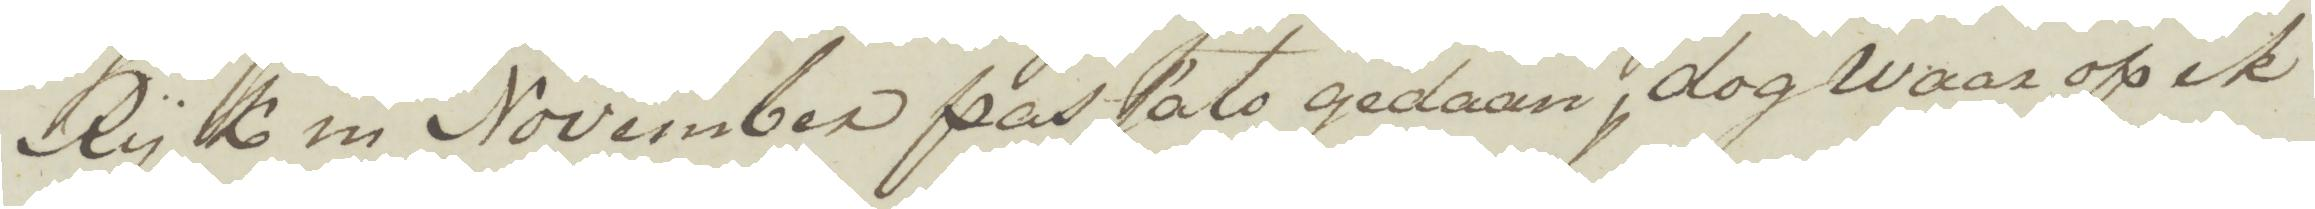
Rijk in November passato gedaan, dog waar op ik
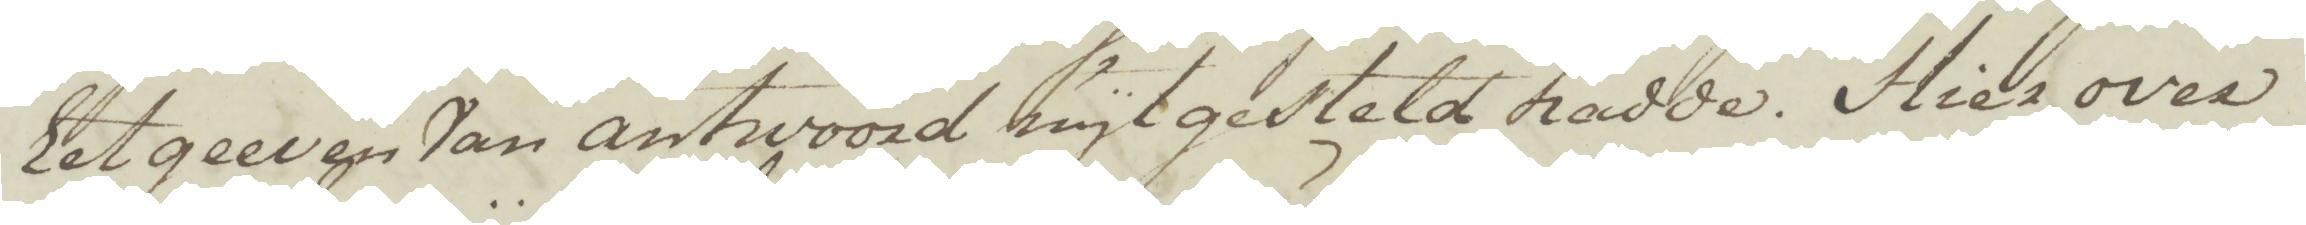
het geeven van antwoord uijtgesteld hadde. Hier over
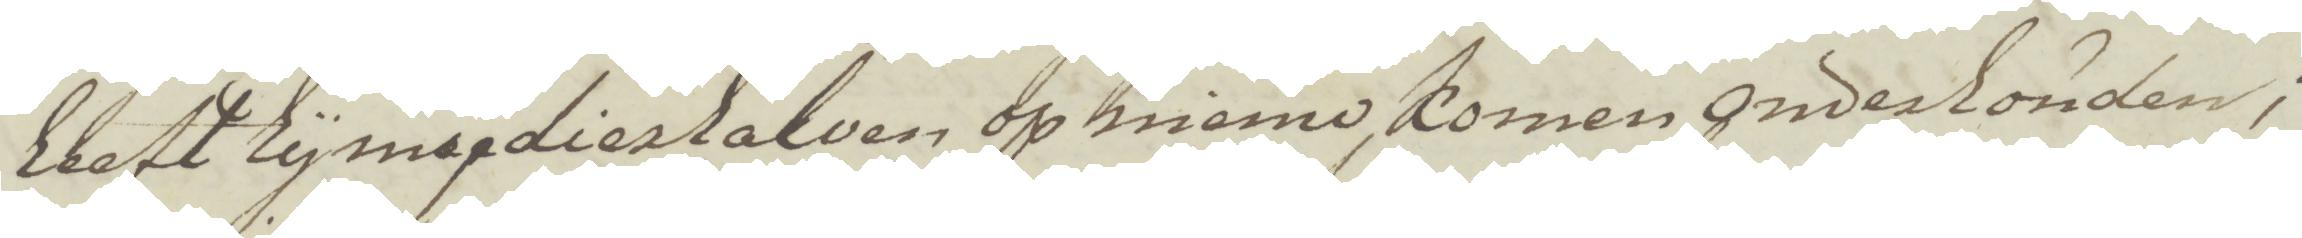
heeft hij mij dierhalven op nieuw komen onderhouden;
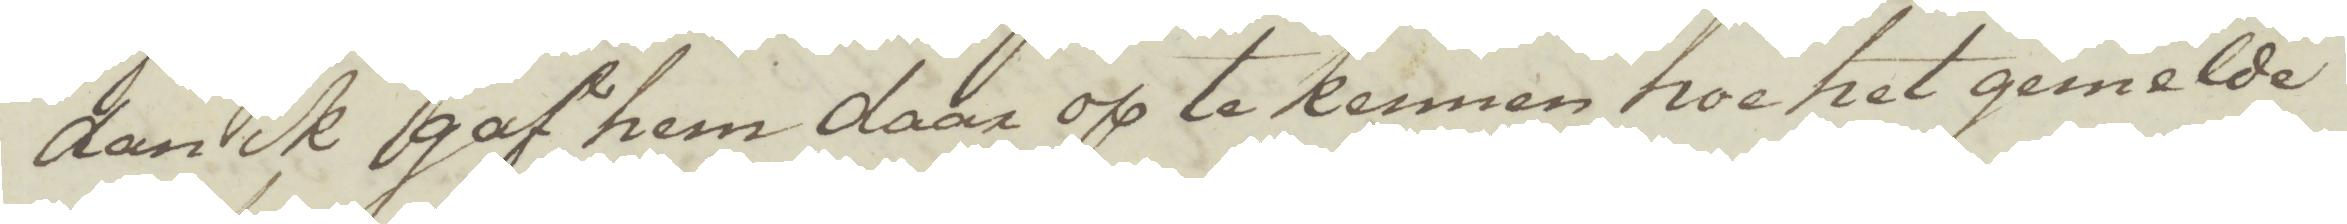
dan ik gaf hem daar op te kennen hoe het gemelde
